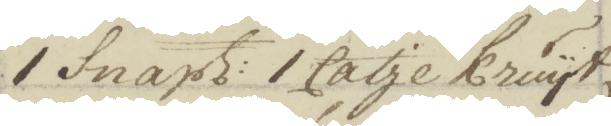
1 snaph: 1 Catje kruijt
